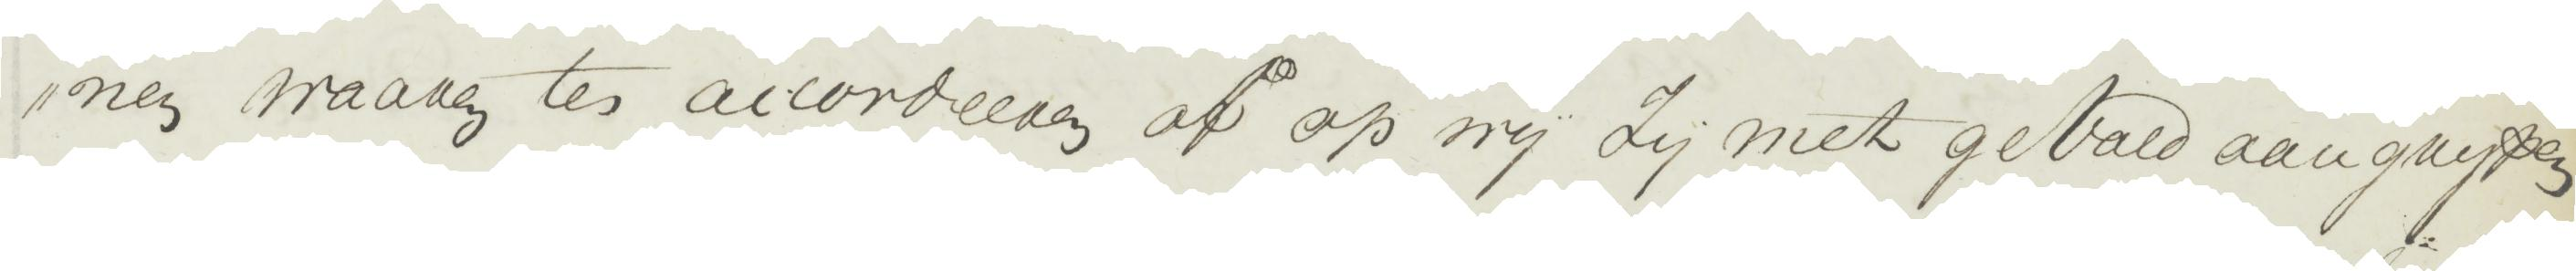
„nen waaren te accordeeren of op wij zij met gevald aangrijpen
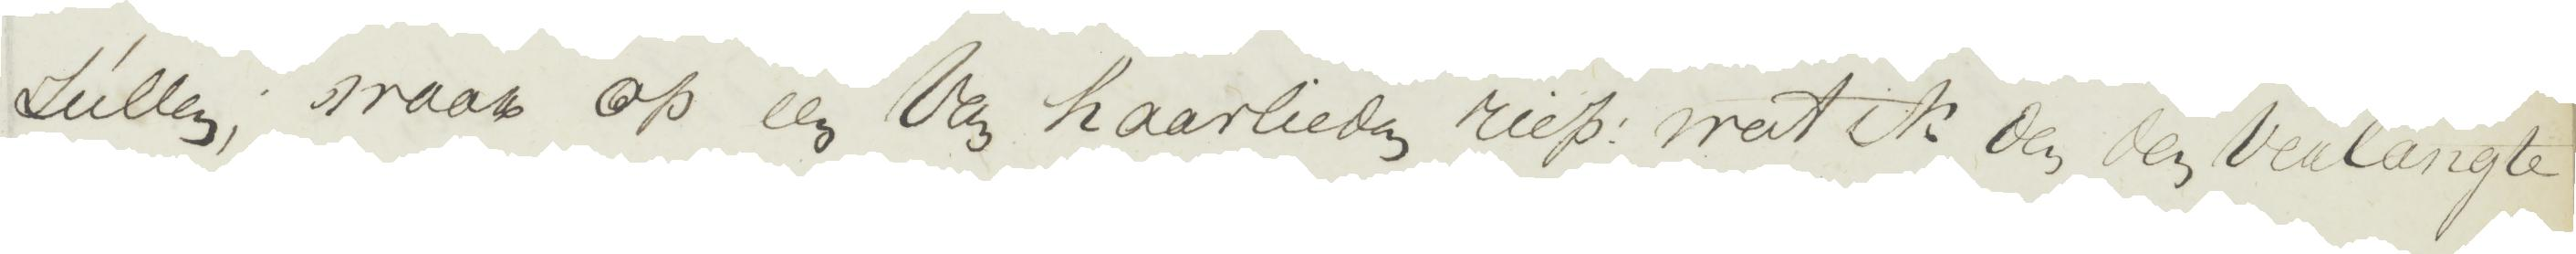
zullen; waar op een van haarlieden riep: wat ik den den verlangte
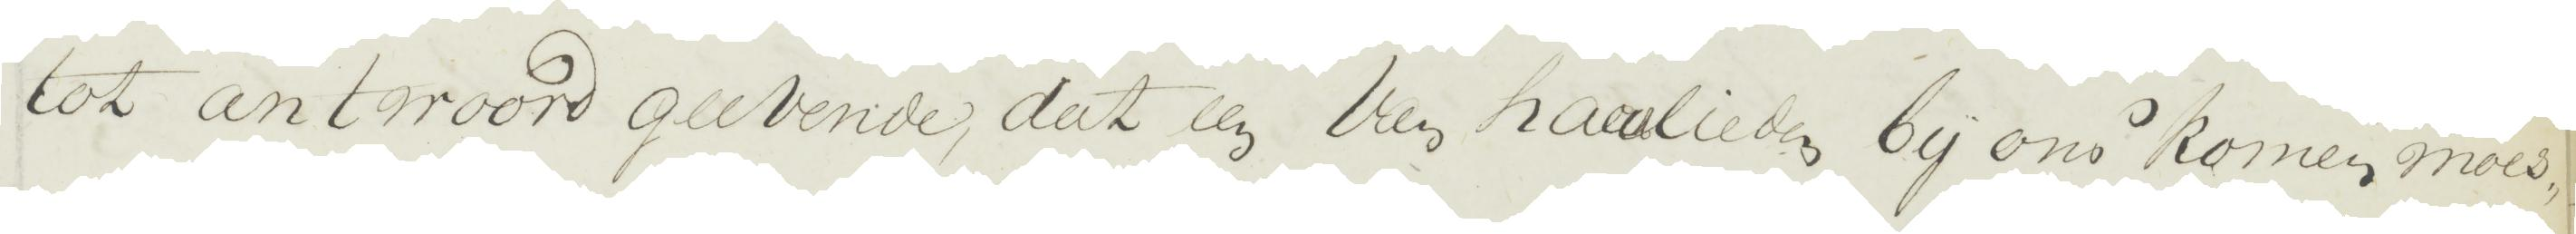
tot antwoord geevende, dat een van haarlieden bij ons komen moes„
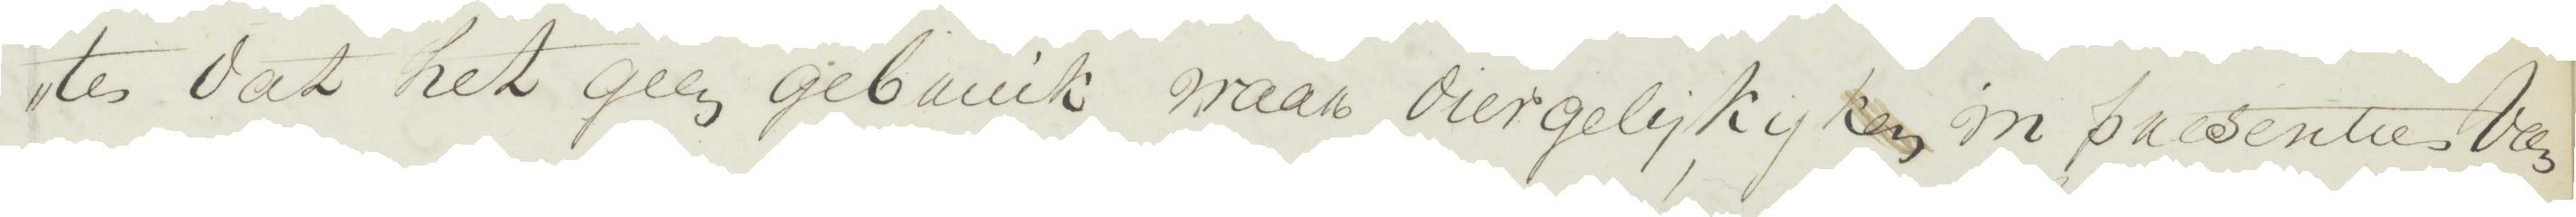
„te dat het geen gebruik waar dier gelijkijken in presentie van
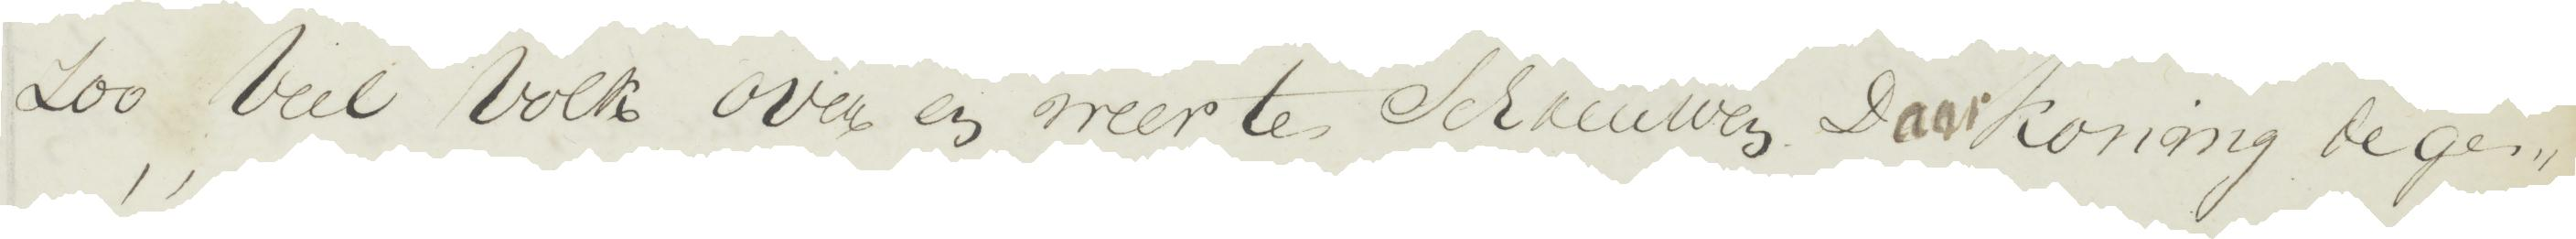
zoo veel volk over en weer te schreuwen Daar Koning de ge„
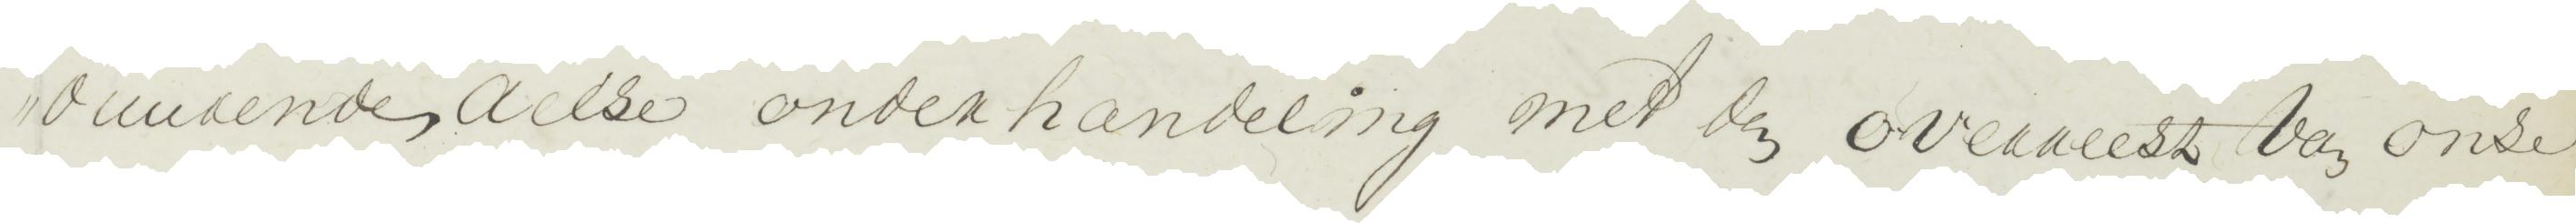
„duurenden deese onderhandeling met den overreest van onse
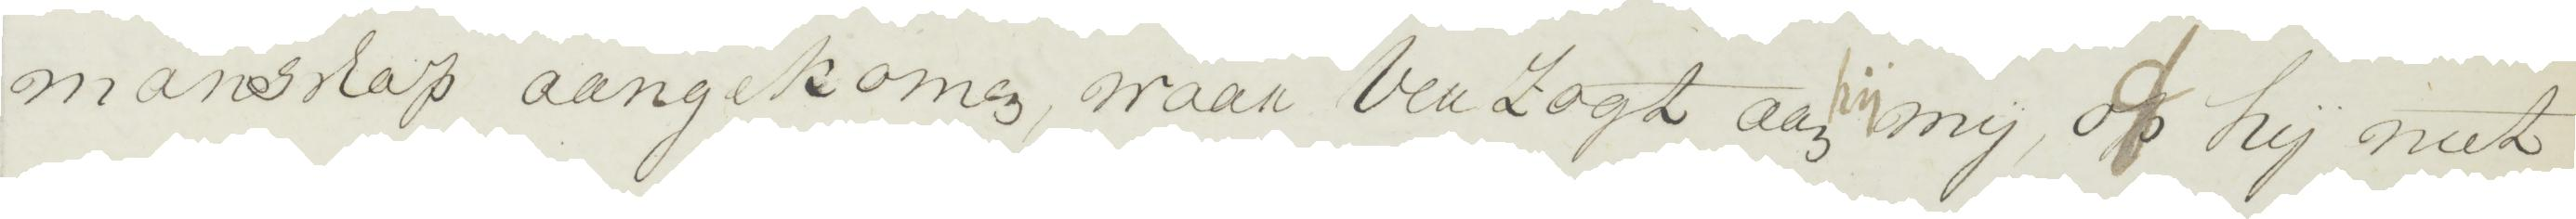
manschap aangekomen, waar verzogt aan hij mij, of hij niet
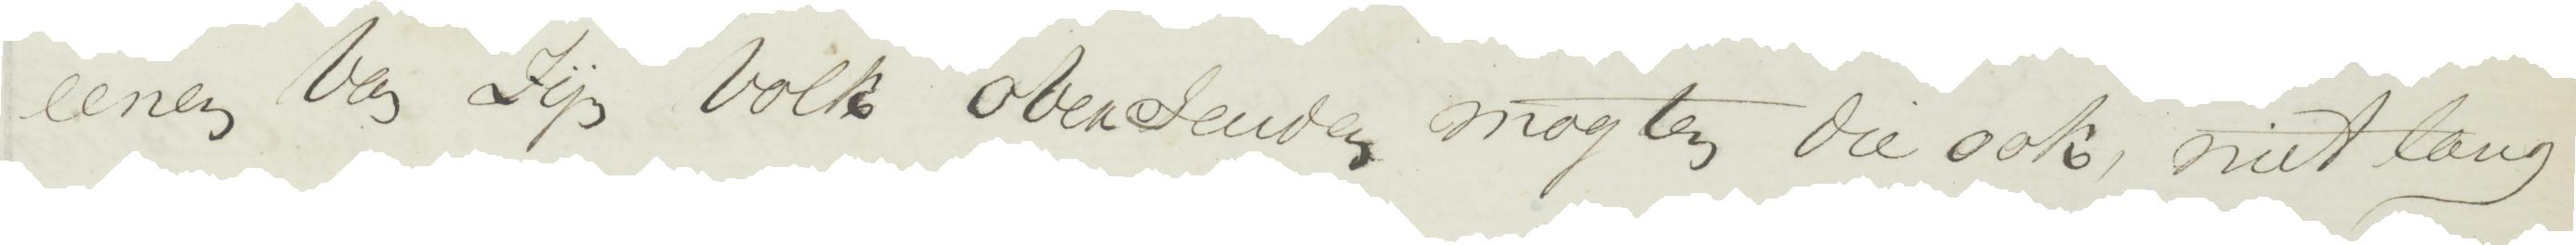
eenen van zijn volk oversenden mogten die ook, niet lang
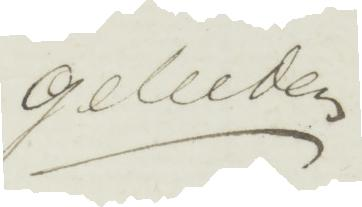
geleeden
